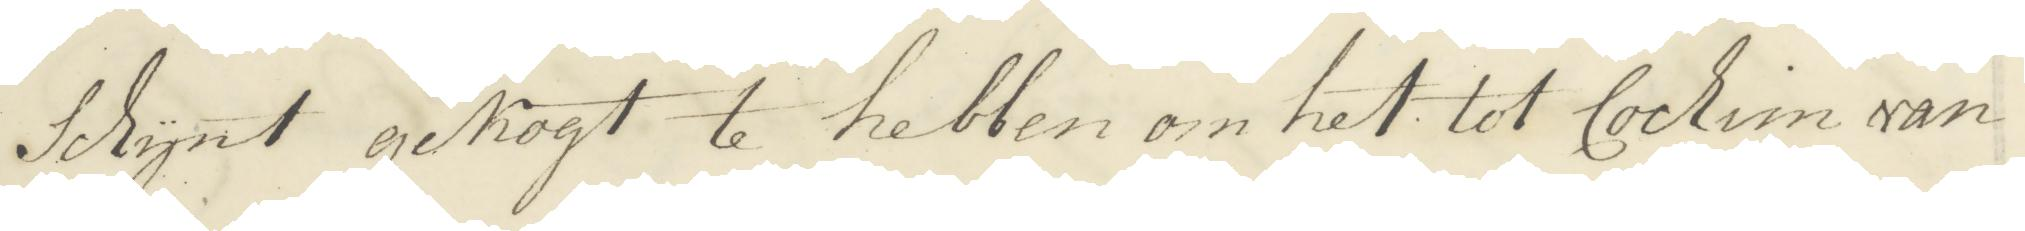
schijnt gekogt te hebben om het tot Cochim van
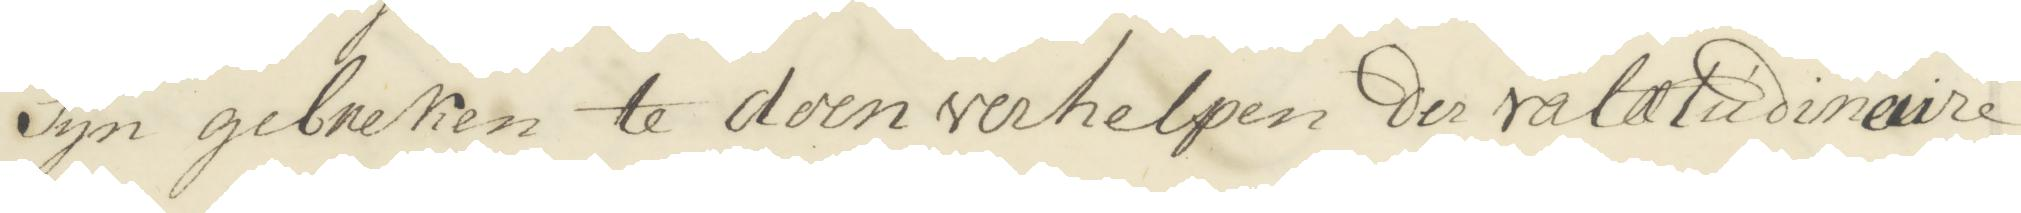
sijn gebreken te doen verhelpen der valaetudinaire
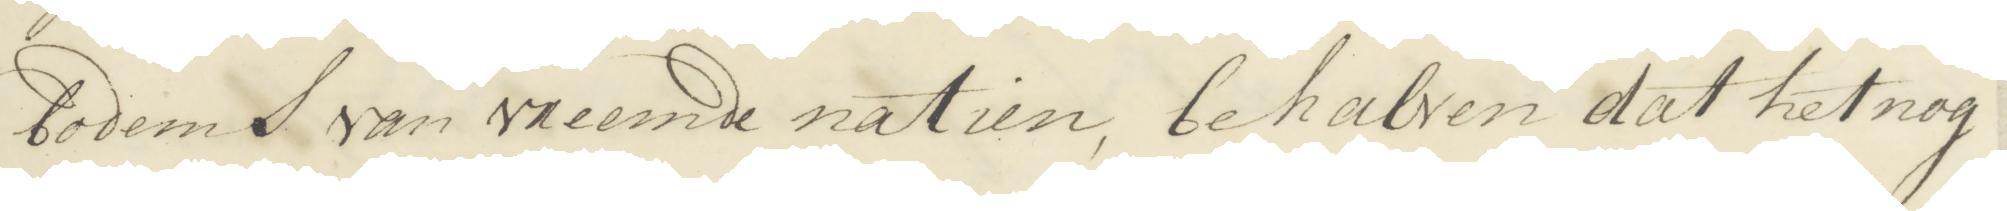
bodems van vreemde natien, behalven dat het nog
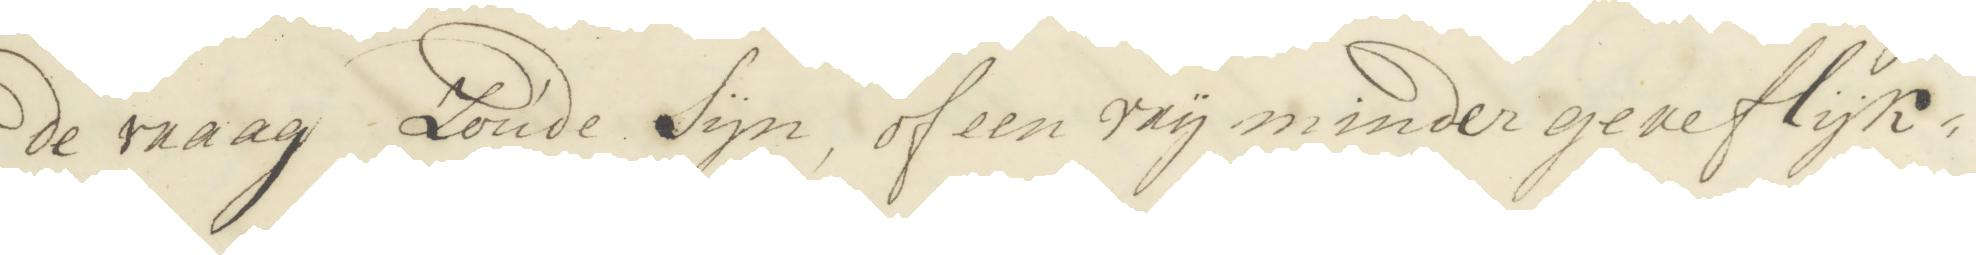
de vraag zoude sijn, of een vrij minder gereflijk„
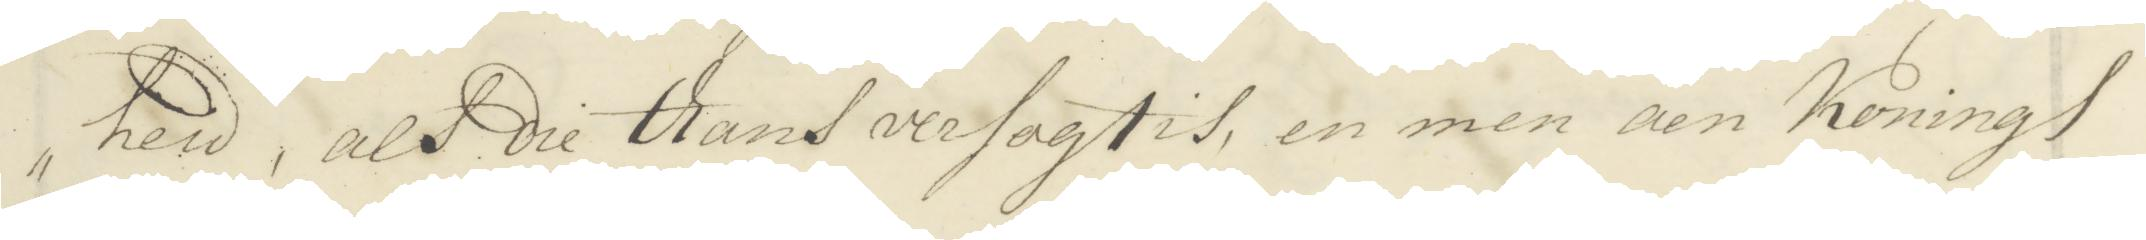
„heid, als die thans versogt is, en men aen Konings
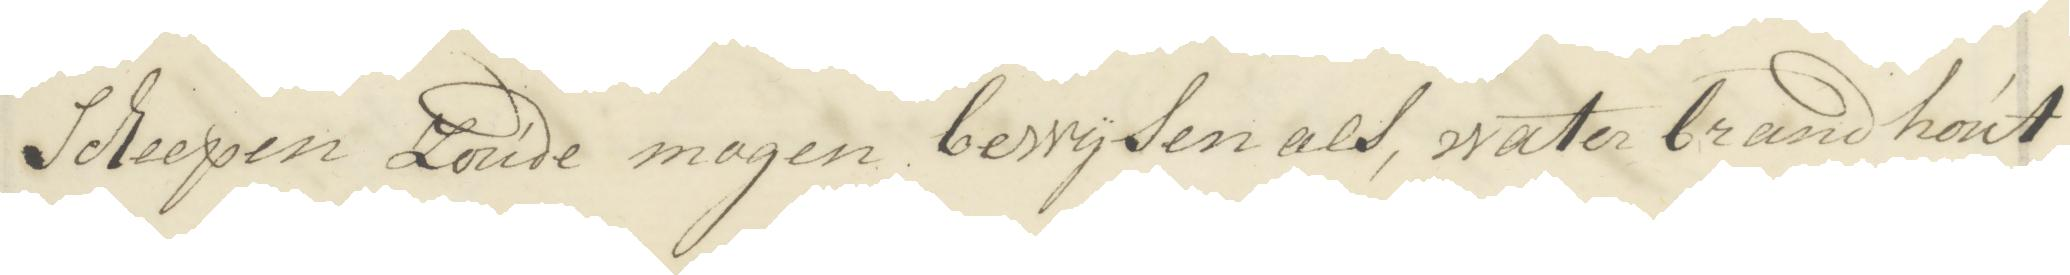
scheepen zoude mogen bewijsen als, water brandhout
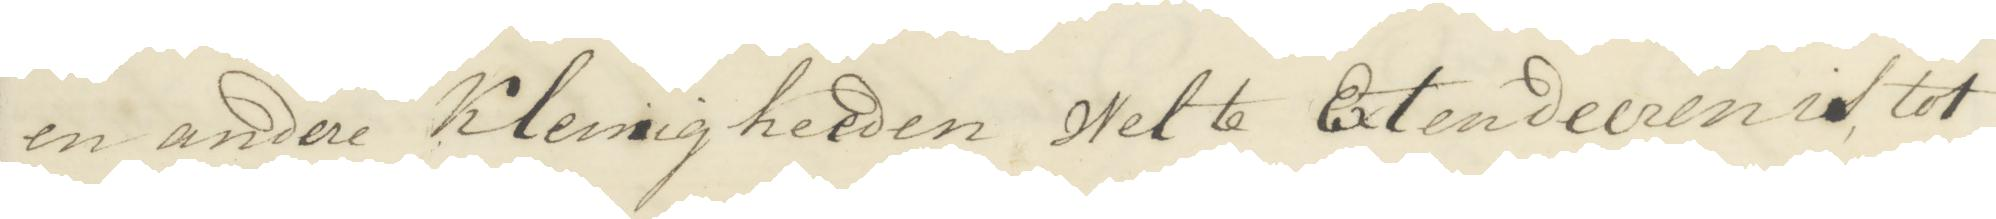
en andere kleinigheeden wel te Extendeeren is, tot
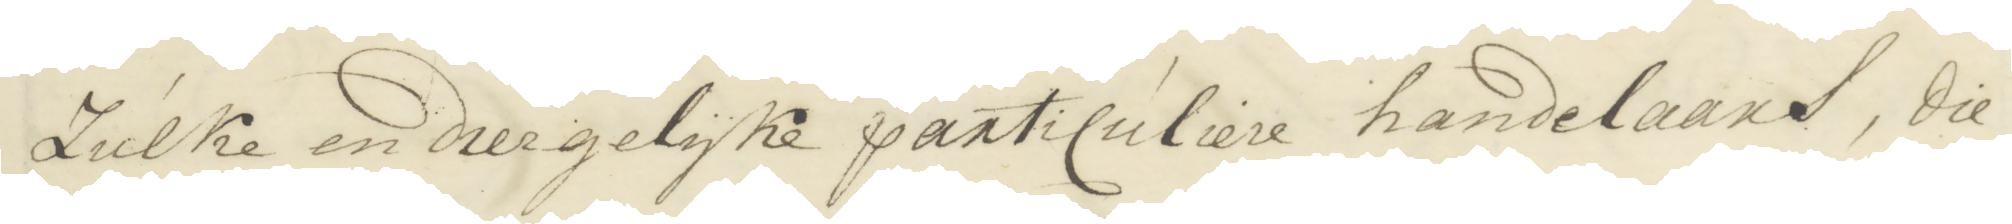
zulke en diergelijke particuliere handelaars, die
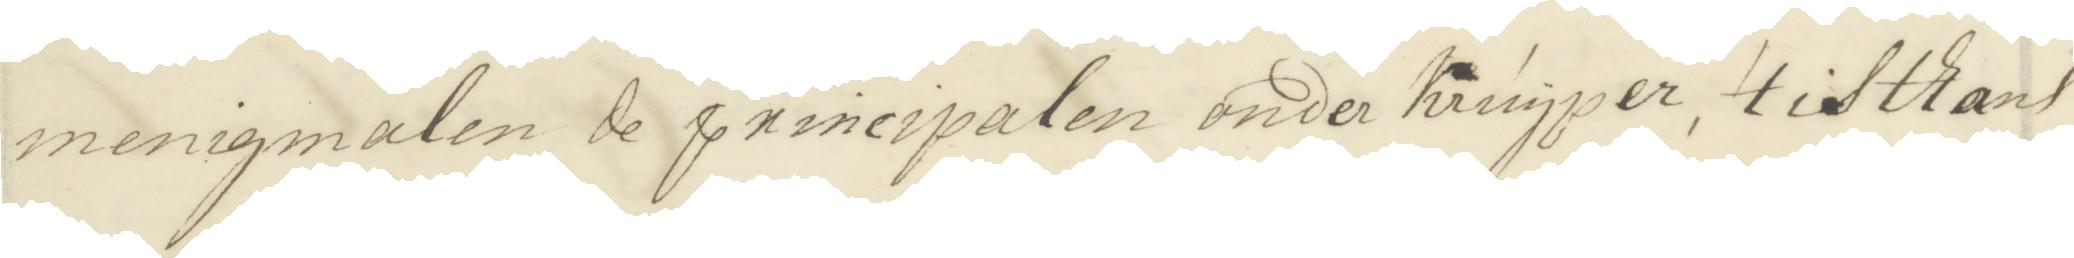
menigmalen de principalen onder kruijper, ’t is thans
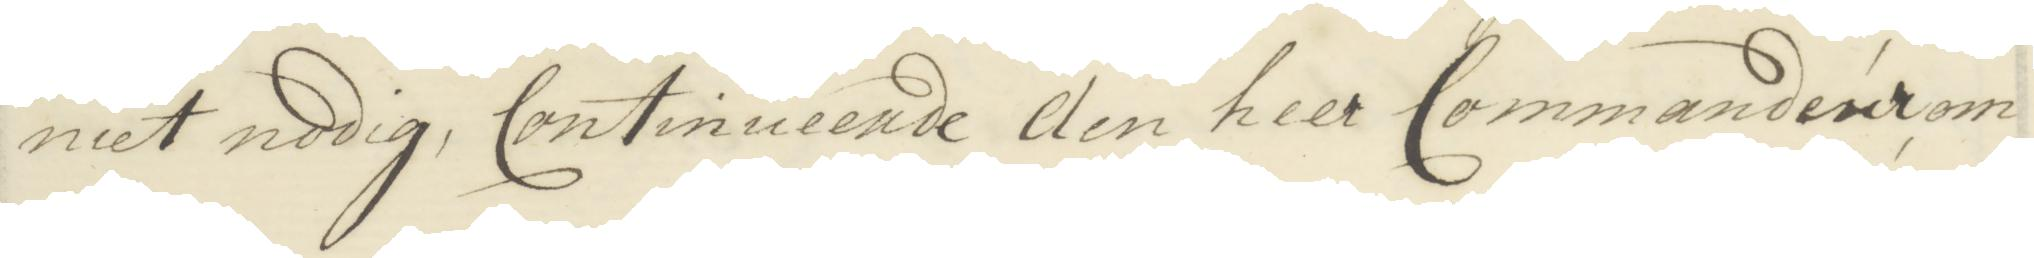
niet nodig, Continueerde den heer Commandeur, om
